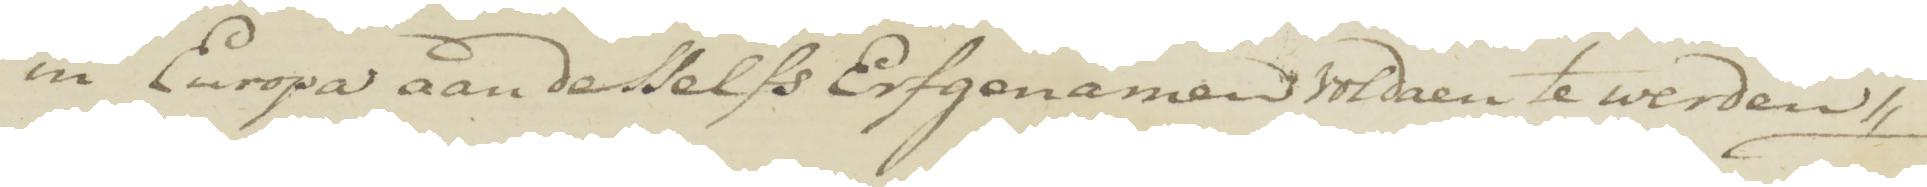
in Europa aan desselfs Erfgenamen voldaen te werden„
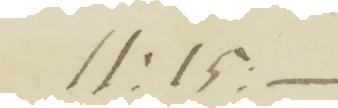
11:15: —
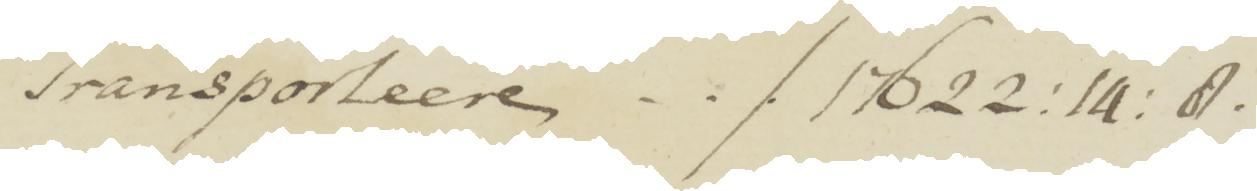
Transporteere - - ƒ 17622:14:8.
